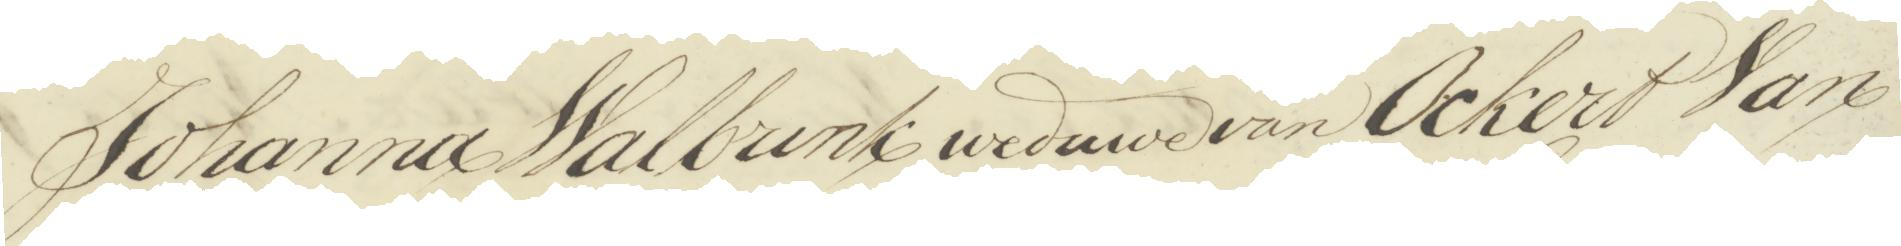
Johanna Walbrink weduwe van Ockert Van
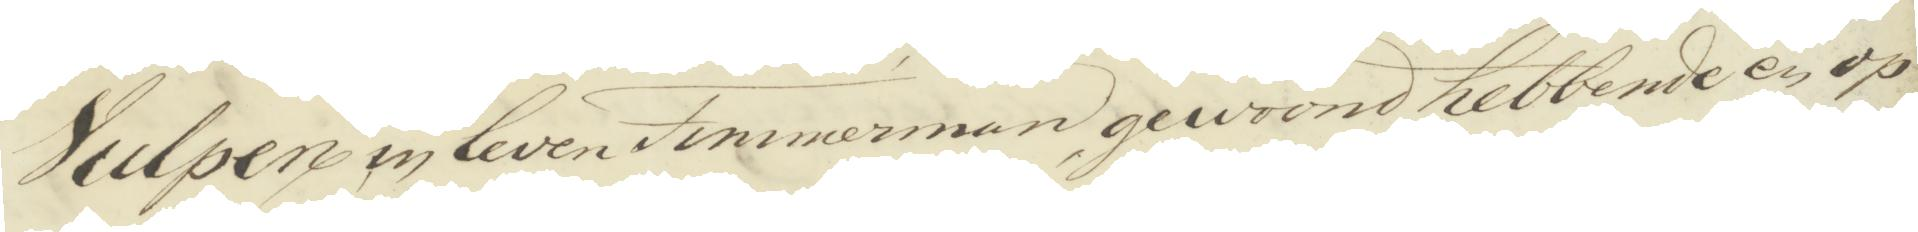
Vulpen in leven Timmerman gewoond hebbende en op
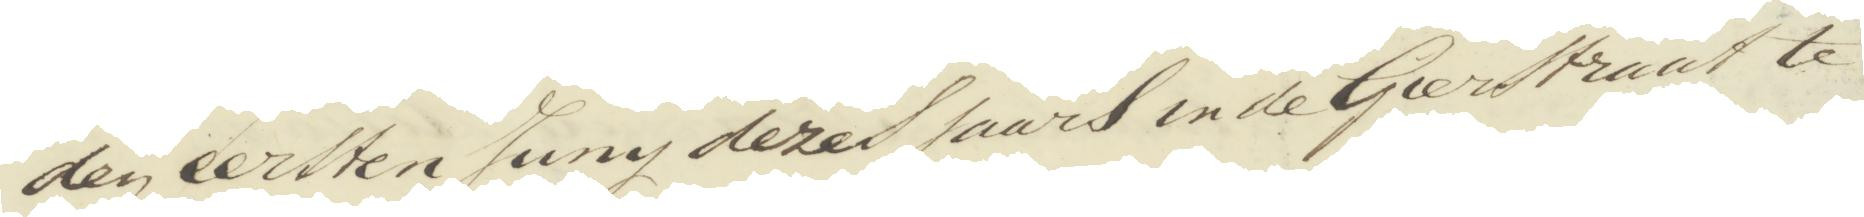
den eersten Juny dezes Jaars in de Gierstraat te
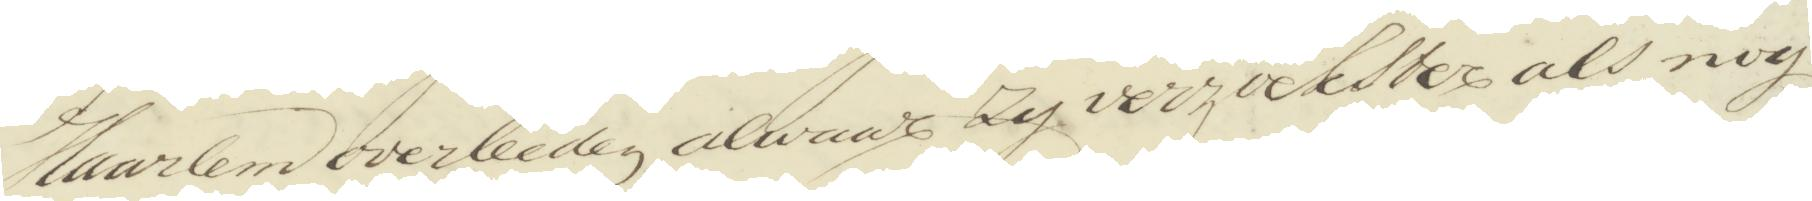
Haarlem overleeden alwaar zij verzoekster als nog
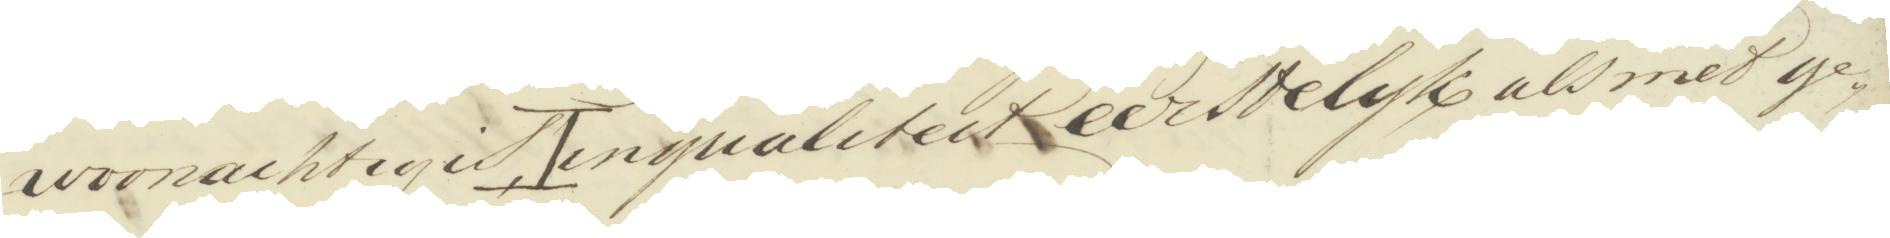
woonachtigis, ¶ in qualiteit eerstelyk als met ge„
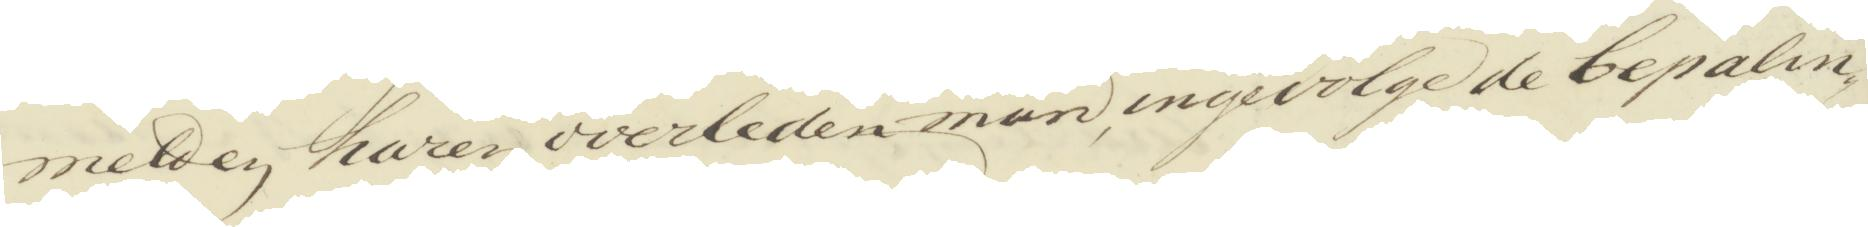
melden haren overleden man ingevolge de bepalin„
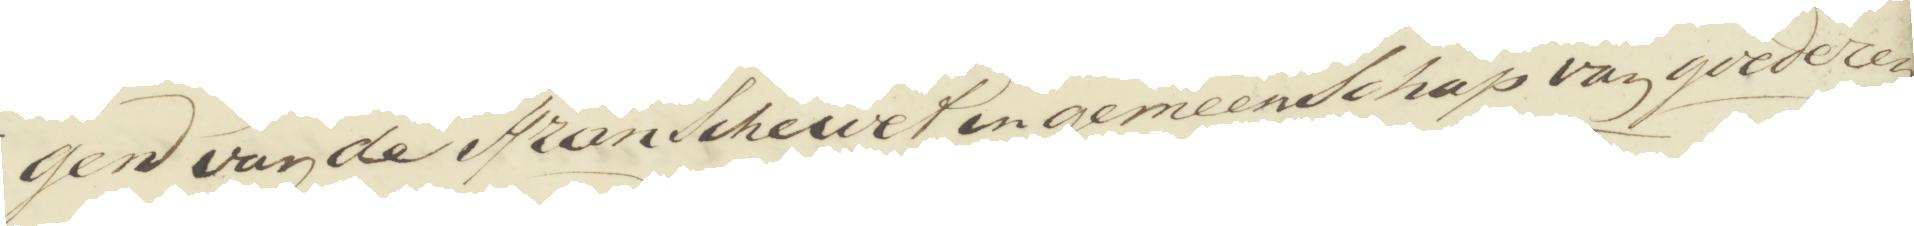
gen van de Fransche wet in gemeenschap van goederen
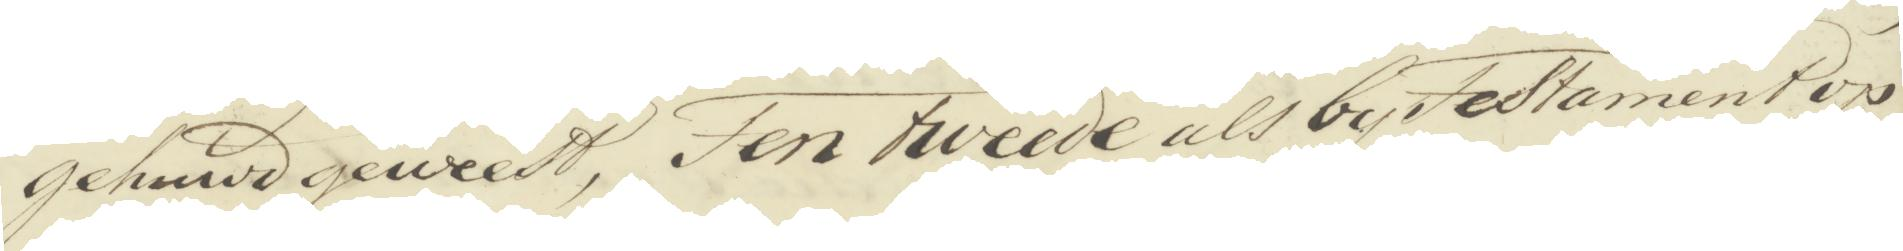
gehuwd geweest, Ten tweede als by Testament op
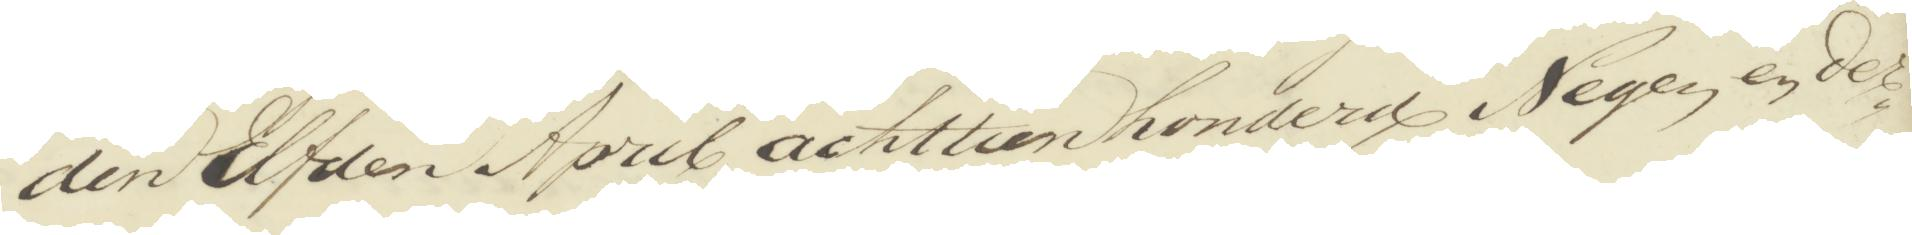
den Elfden April achttienhonderd Negen en der„
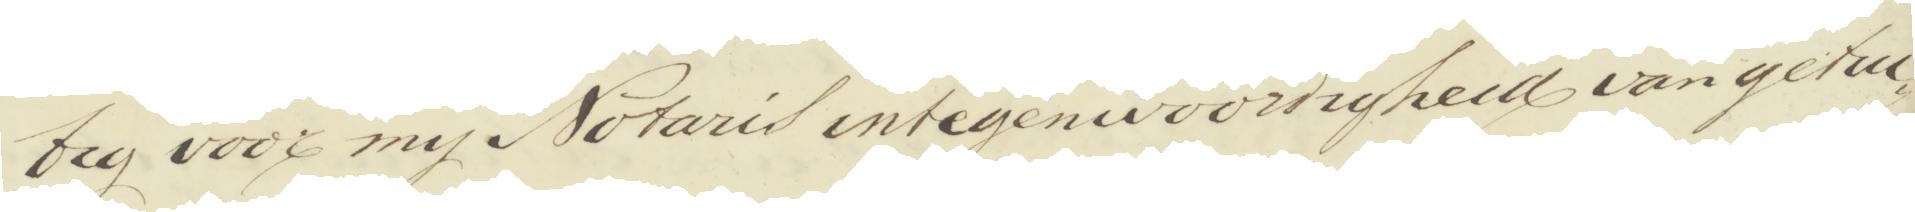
tig voor my Notaris in tegenwoordigheid van getui„
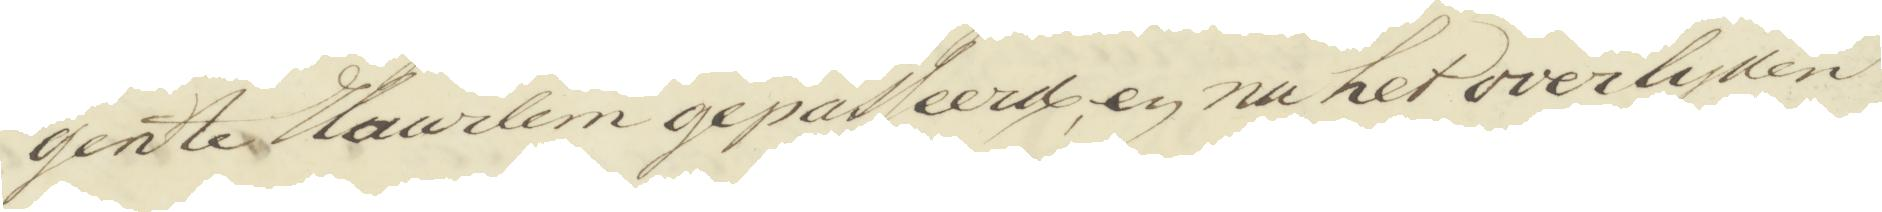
gen te Haarlem gepasseerd en na het overlyden
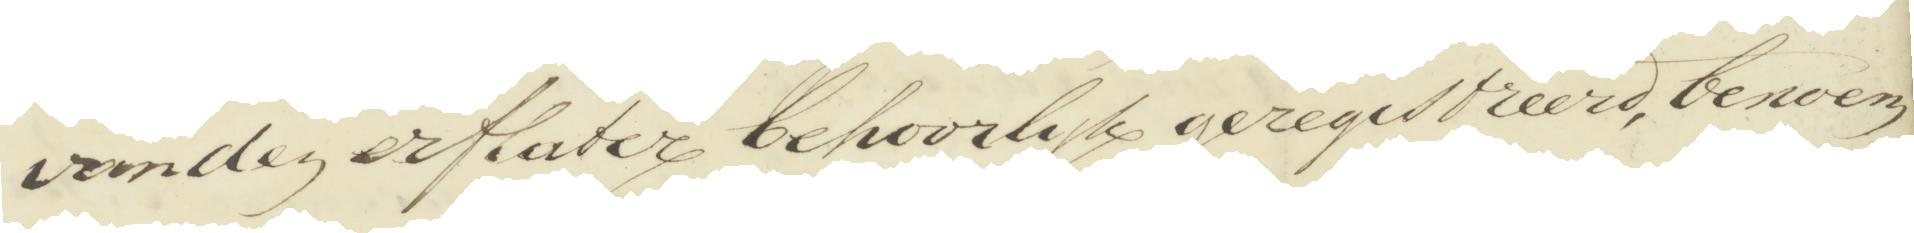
van den erflater behoorlyk geregistreerd, benoem
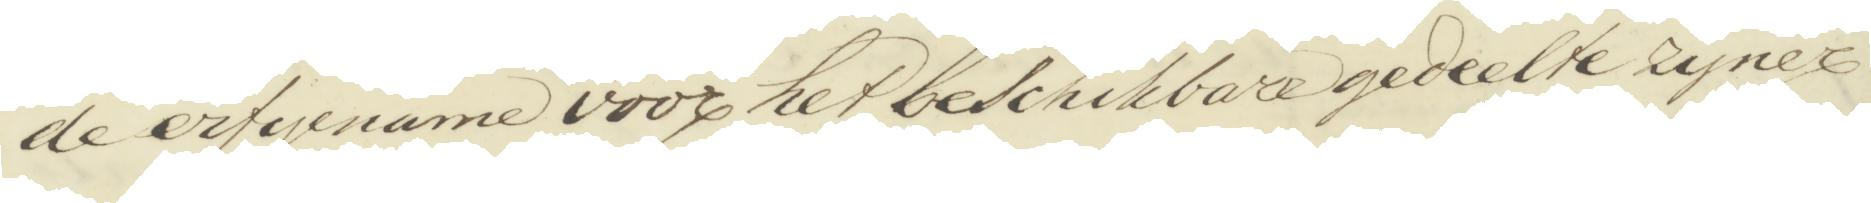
de erfgename voor het beschikbare gedeelte zyner
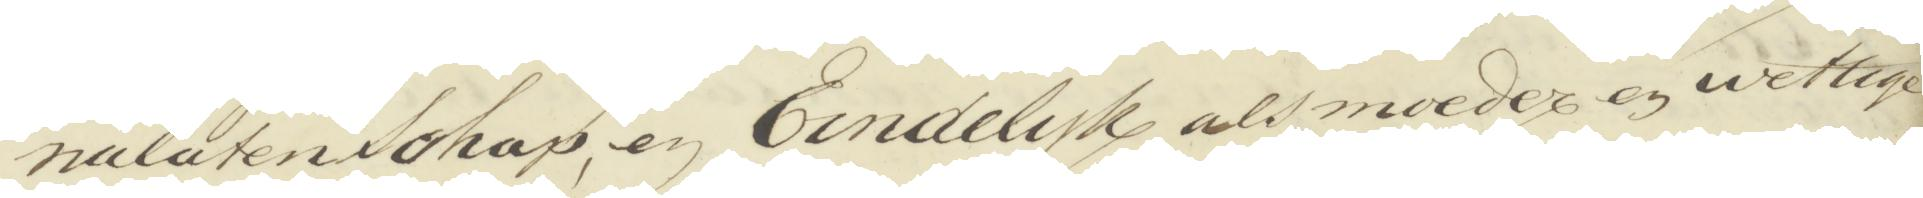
nalatenschap, en Eindelyk als moeder en wettige
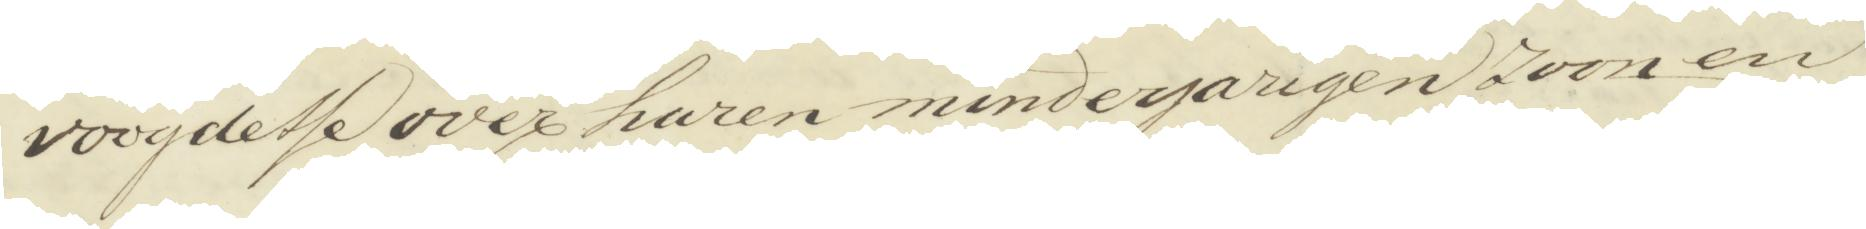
voogdesse over haren minderjarigen zoon en
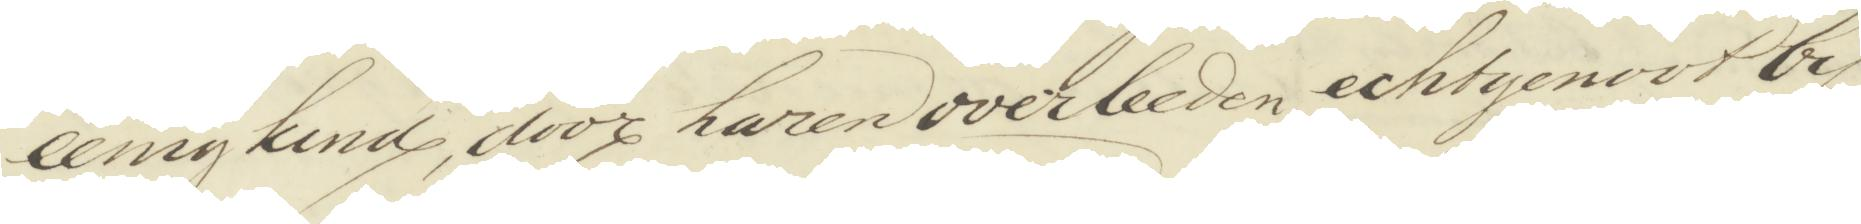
eenig kind, door haren overleeden echtgenoot by
